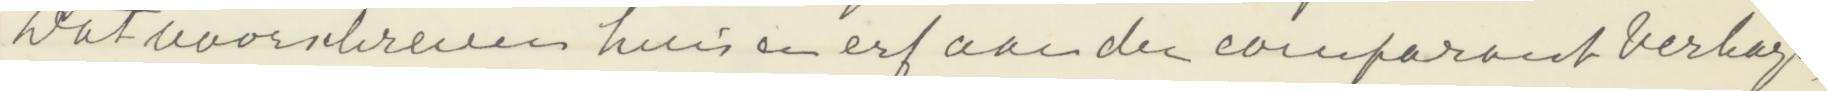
Dat voorschreven huis en erf aan den comparant Verhagen
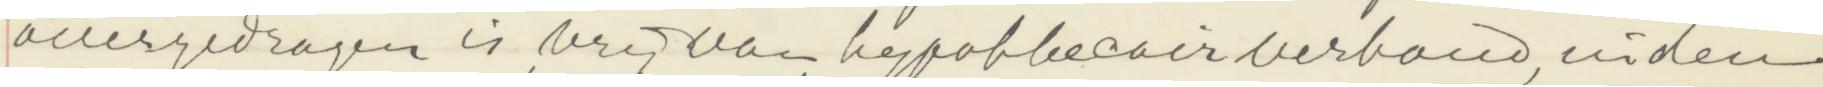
overgedragen is vrij van hypothecair verband, in den
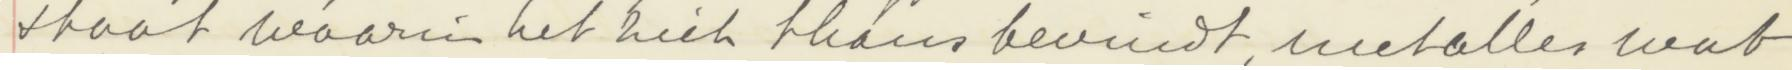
staat waarin het zich thans bevindt, met alles wat
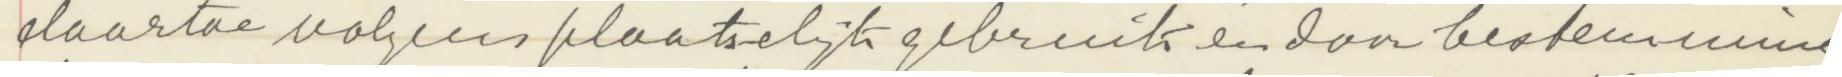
daartoe volgens plaatselijk gebruik en door bestemming
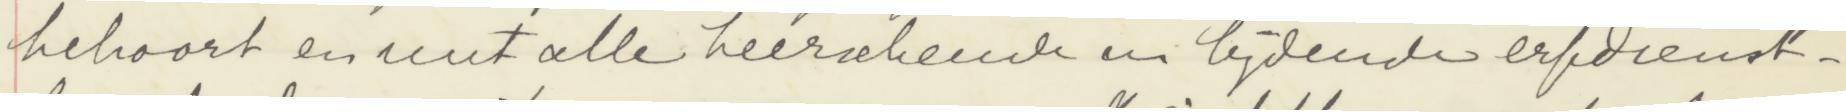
behoort en met alle heerschende en lijdende erfdienst-
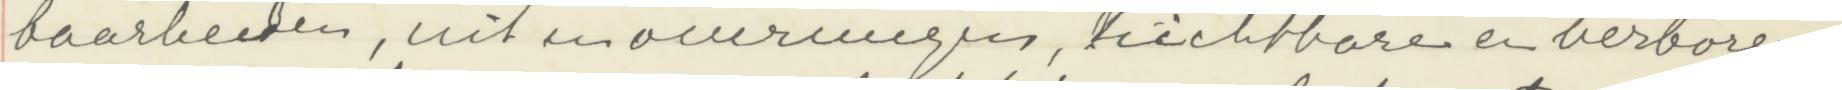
baarheeden, uit en overwegen, zichtbare en verborgen
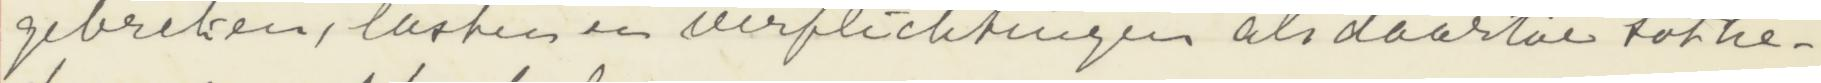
gebreken, lasten en verplichtingen als daartoe tot he-
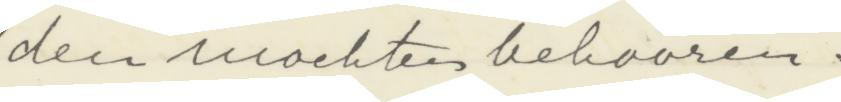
den mochten behooren.
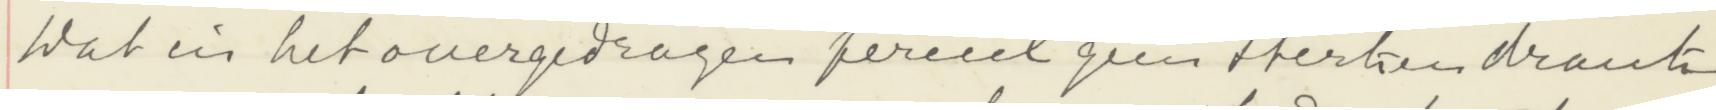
Dat in het overgedragen perceel geen sterken drank
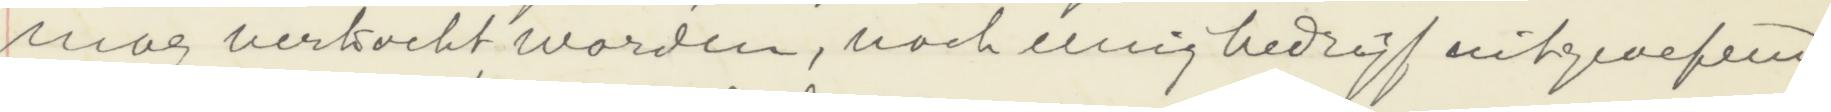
mag verkocht worden, noch eenig bedrijf uitgeoefend
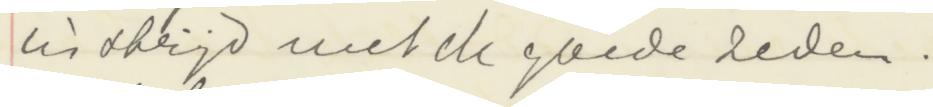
in strijd met de goede zeden.
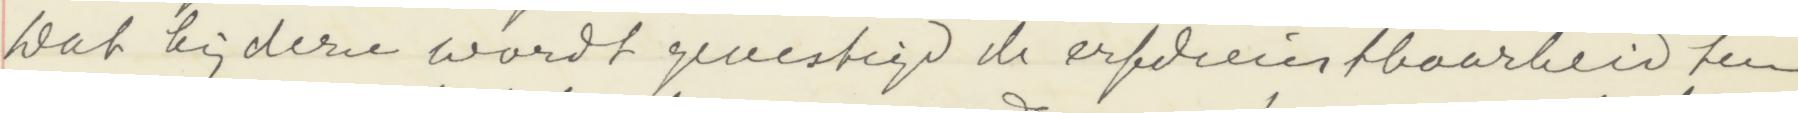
Dat bij deze wordt gevestigd de erfdienstbaarheid ten
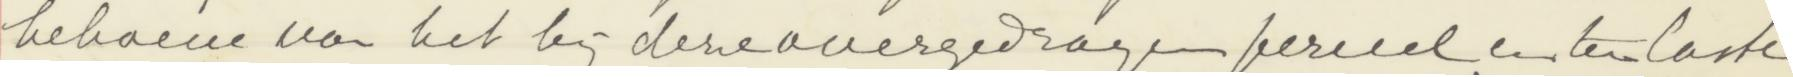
behoeve van het bij deze overgedragen perceel en ten laste
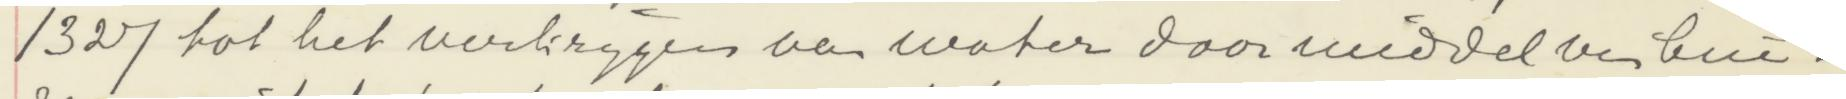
1327 tot het verkrijgen van water door middel van bui-
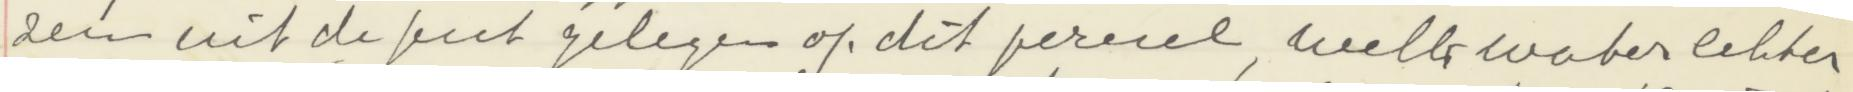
dzn uit de put gelegen op dit perceel, welk water echter
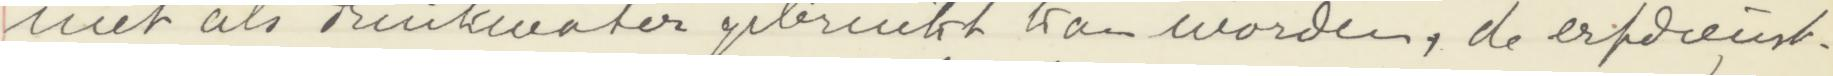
niet als drinkwater gebruikt kan worden, de erfdienst-
